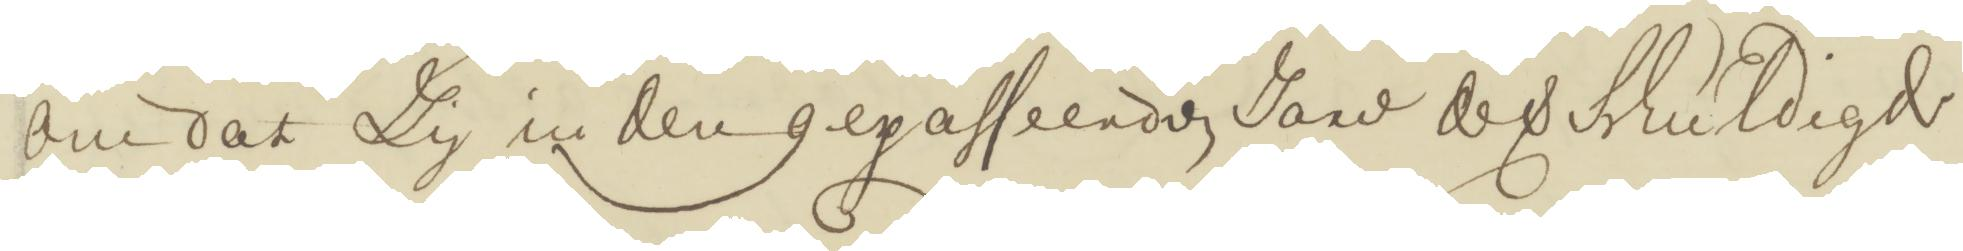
om dat zij in den gepasseerden Iare de verschuldigde
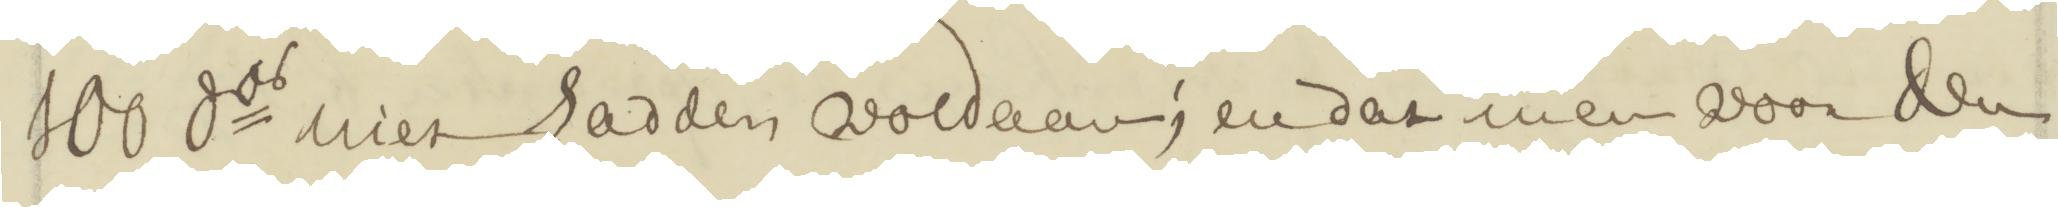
100 d=os niet hadden voldaan; en dat men voor den
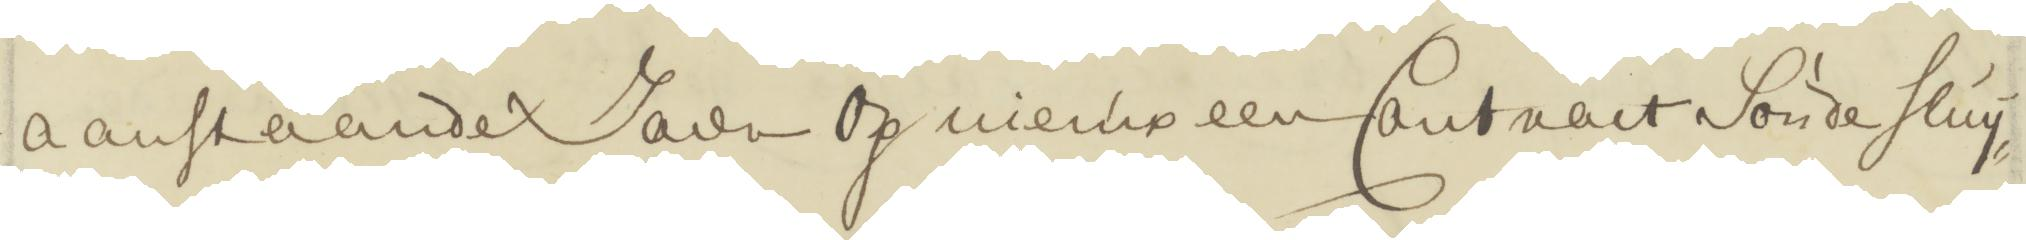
aanstaande Iaer op nieuw een contract soude sluij„
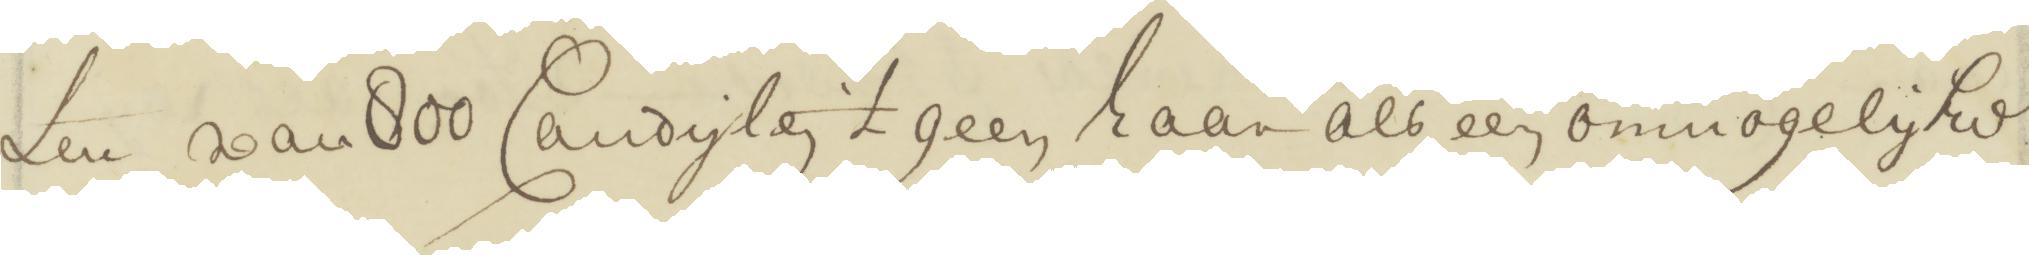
ten van 800 Candijlen ’t geen haar als een onmogelijke
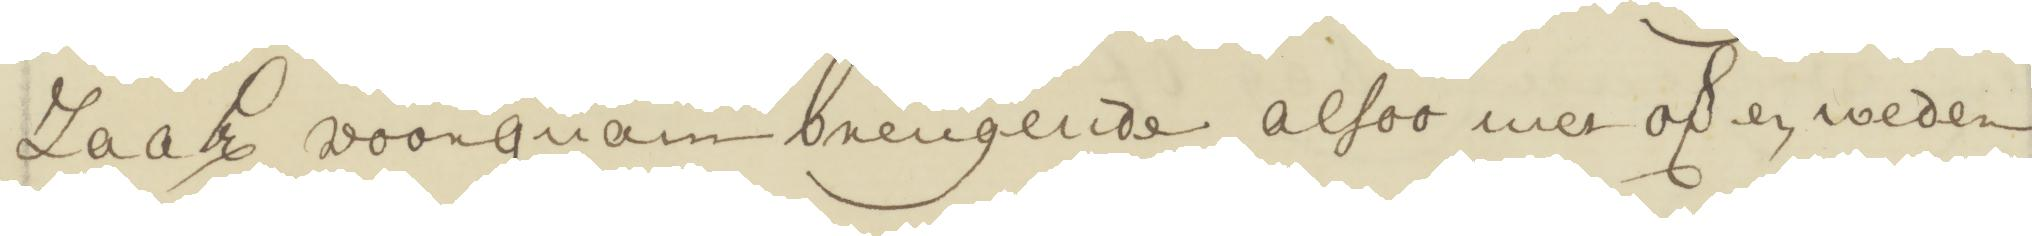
zaak voorquam brengende alsoo met over en weder
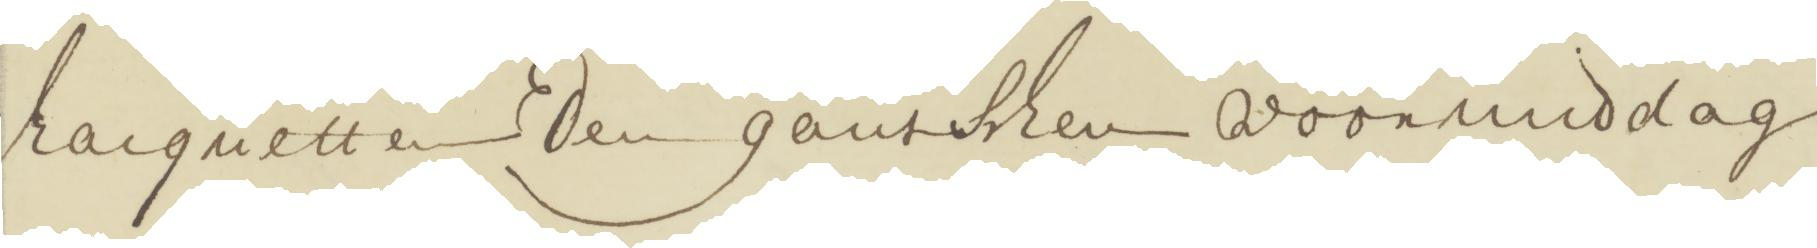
hacquetten den gantschen voormiddag
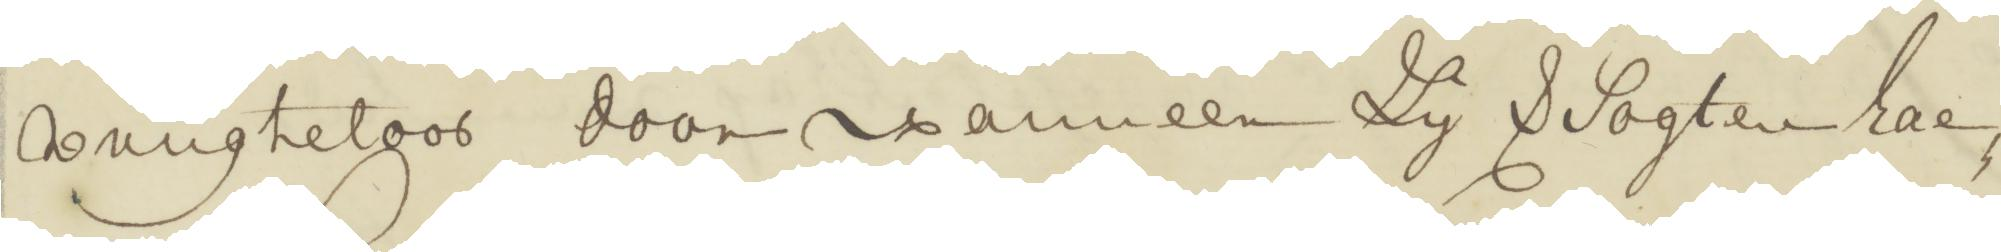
vrugteloos door wanneer zij versogten hae„
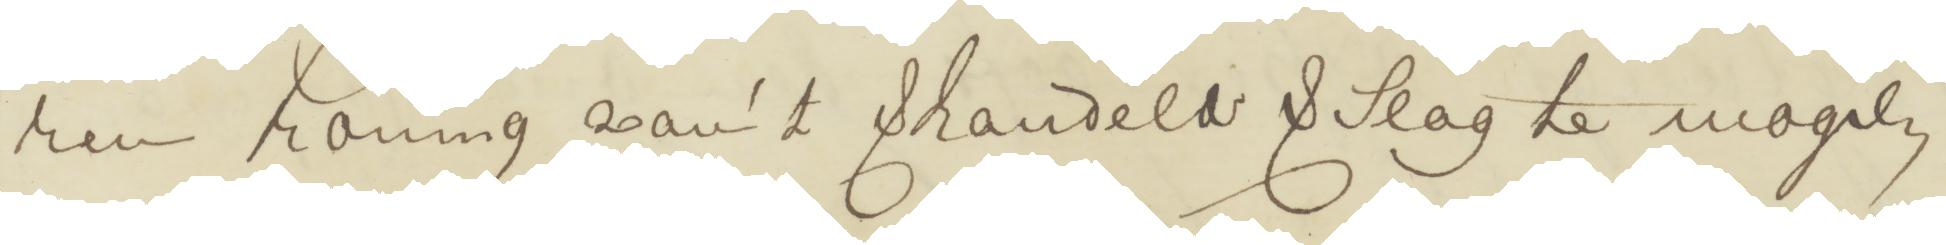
ken koning van ’t verhandelde verslag te mogen
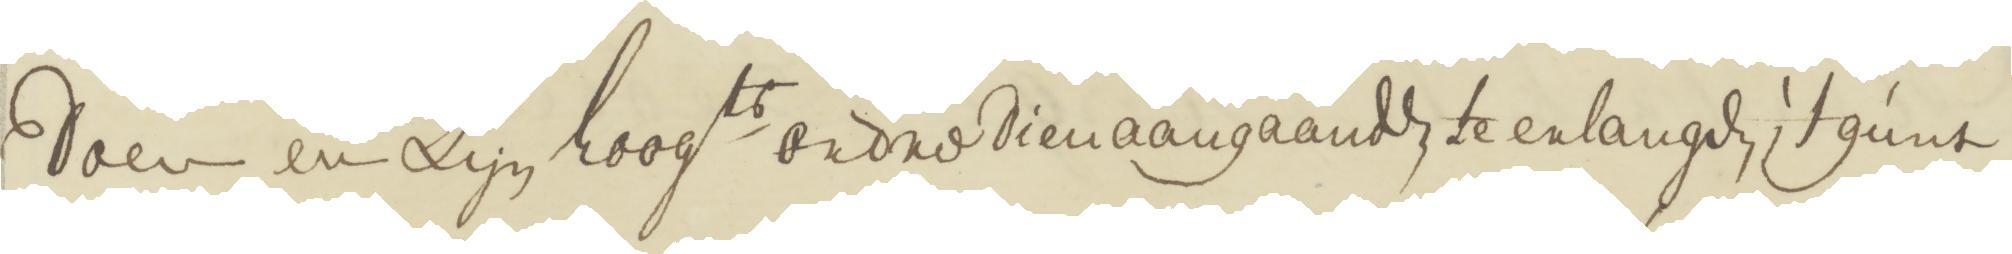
doen en zijn hoog=ts ordre dien aangaanden te erlangen, ’t gunt
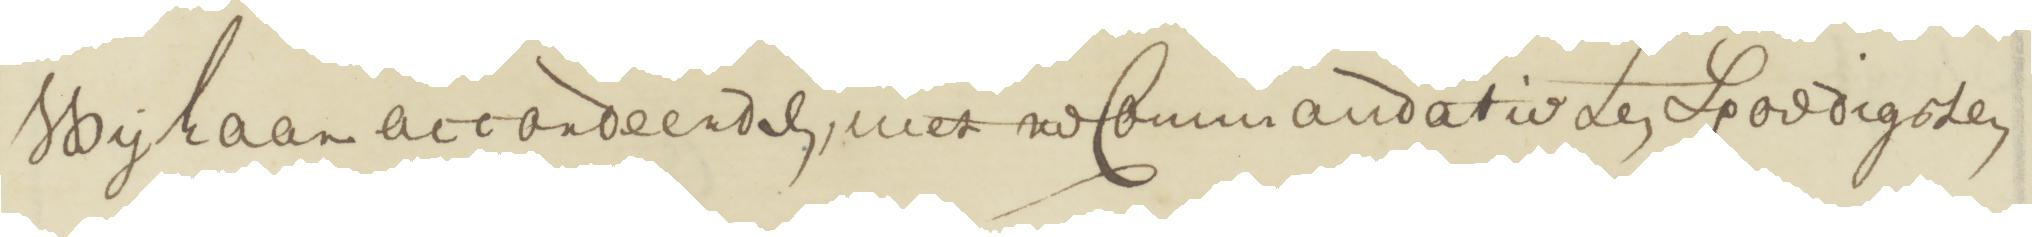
wij haar accordeerden, met recommandatie ten spoedigsten
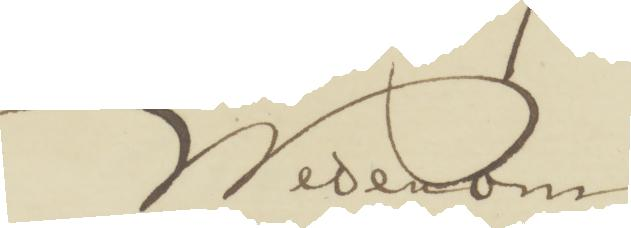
Wederom
